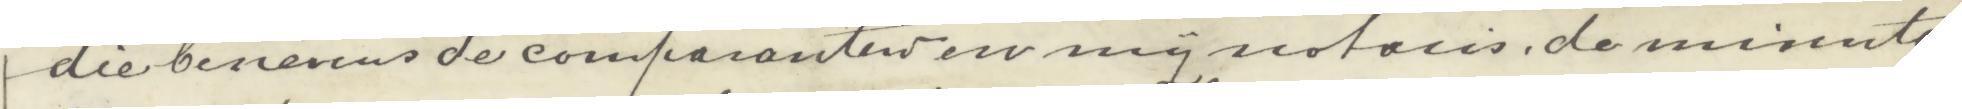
die benevens de comparanten en mij notaris, de minute
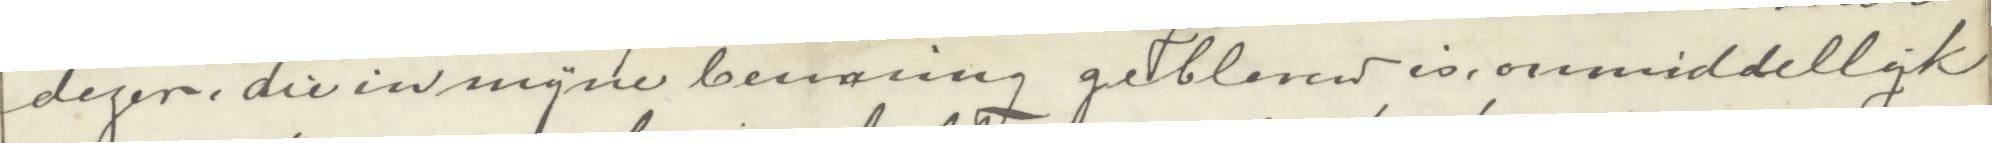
dezer, die in mijne bewaring gebleven is, onmiddellijk
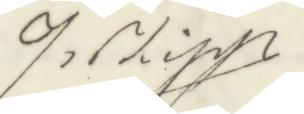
J. Clipp
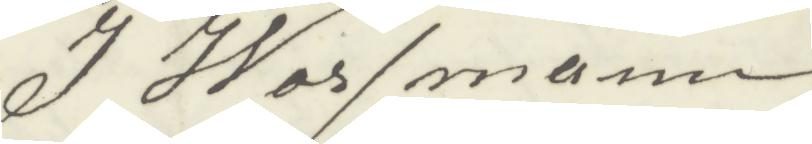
I Wassmann
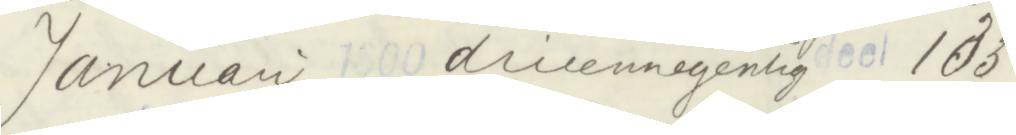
Januari 1800 drieennegentig deel 133
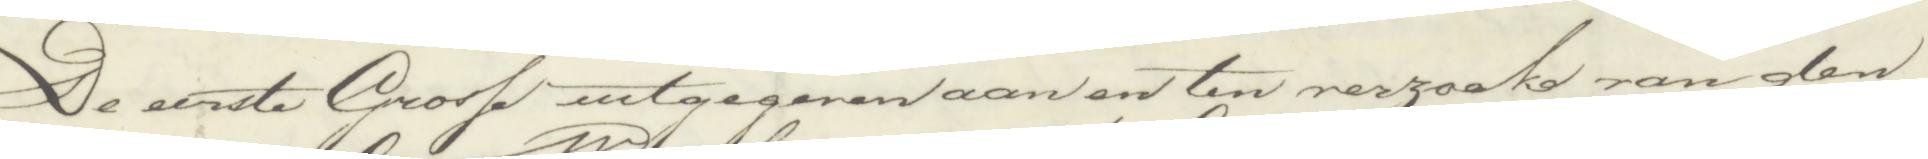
De eerste Grosse uitgegeven aan en ten verzoeke van den
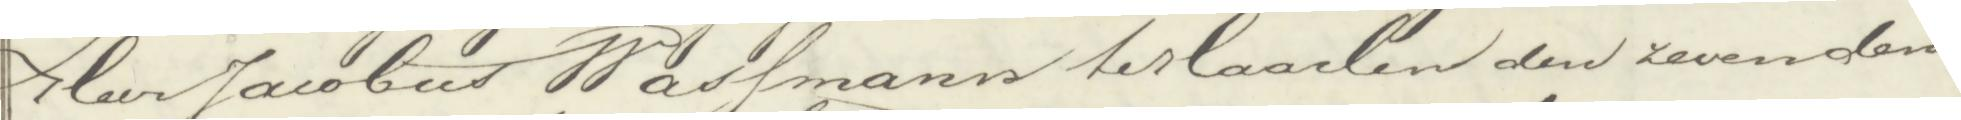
Heer Jacobus Wassmann te Haarlem den zevenden
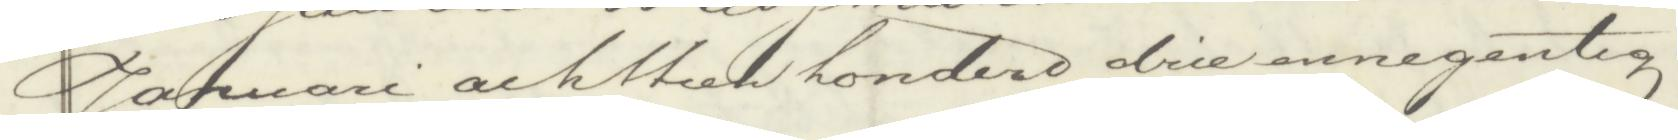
Januari achttien honderd drie ennegentig
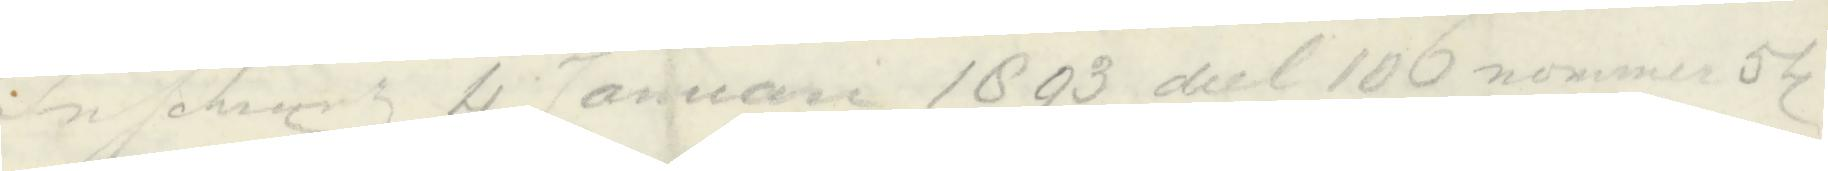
Inschryving 4 Januari 1893 deel 106 nommer 54
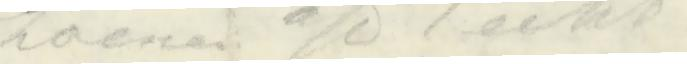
Loenen a/d Vecht
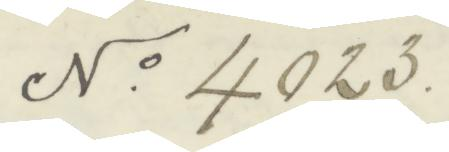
N.o 4023.
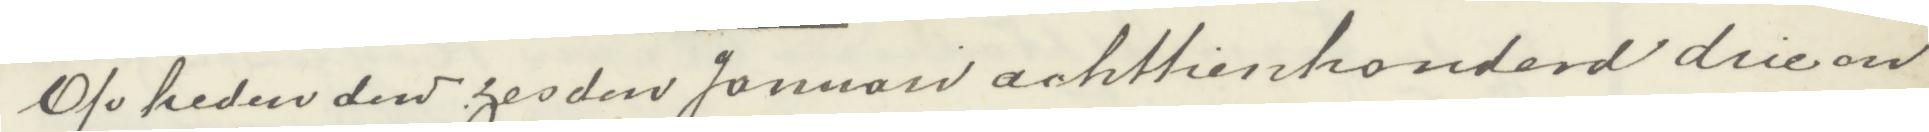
Op heden den zesden Januari achttienhonderd drie en
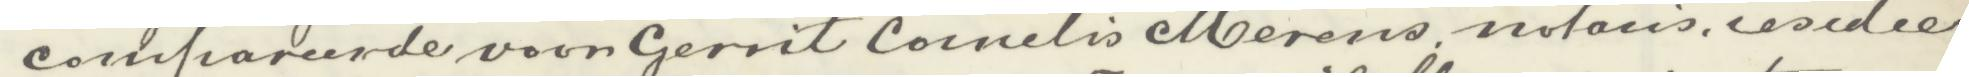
compareerde voor Gerrit Cornelis Merens, notaris, residee
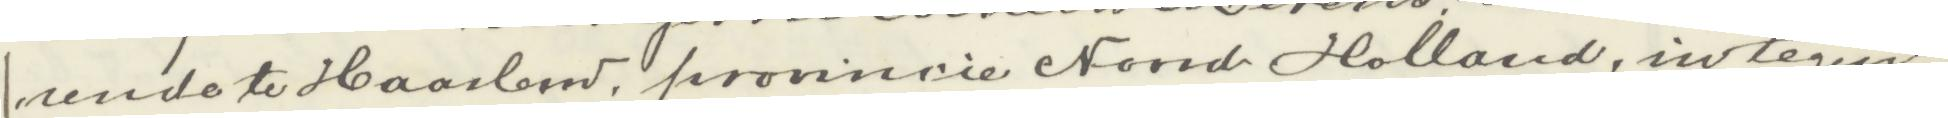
rende te Haarlem, provincie Noord Holland, in tegen=
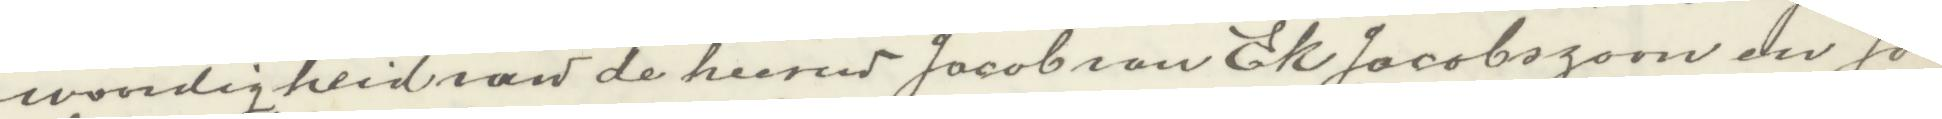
woordigheid van de heeren Jacob van Ek Jacobszoon en Jo
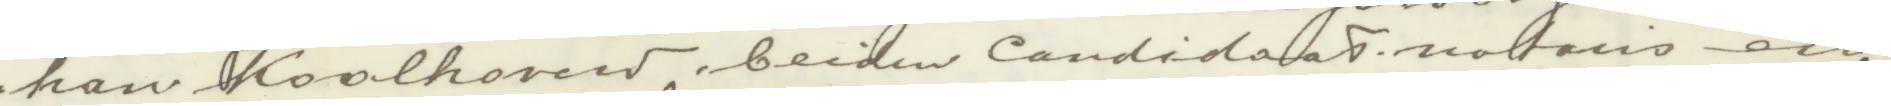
han Koolhoven, beiden Candidaat-notaris en
